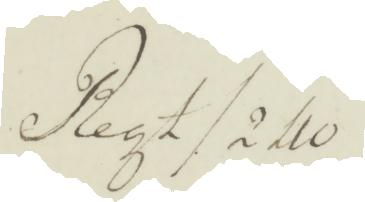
Regt ƒ240
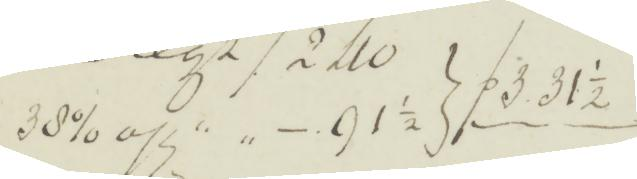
38% opc„ „-. 91½ ƒ 3.31½
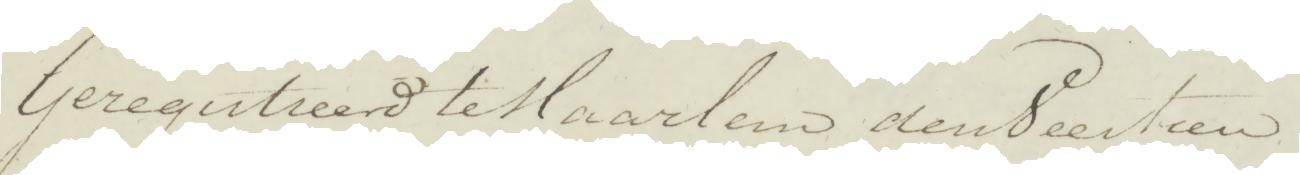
Geregistreerd te Haarlem den Veertien.
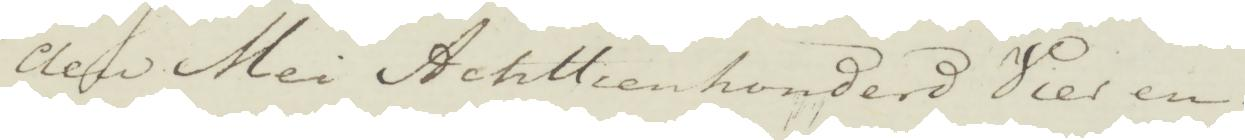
den Mei Achttien honderd Vier en
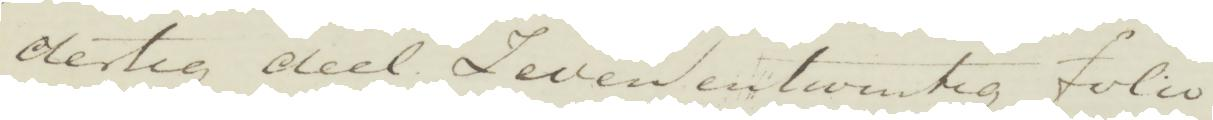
dertig deel Zeven en twintig folio
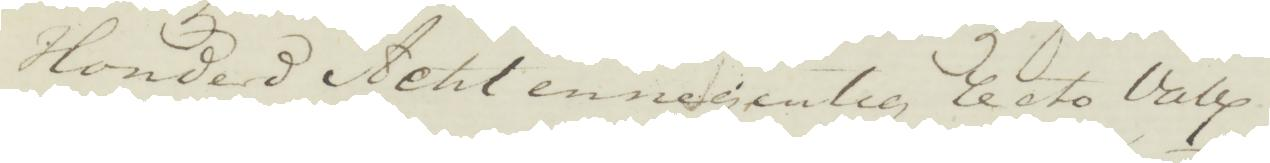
Honderd Acht en negentig recto vak
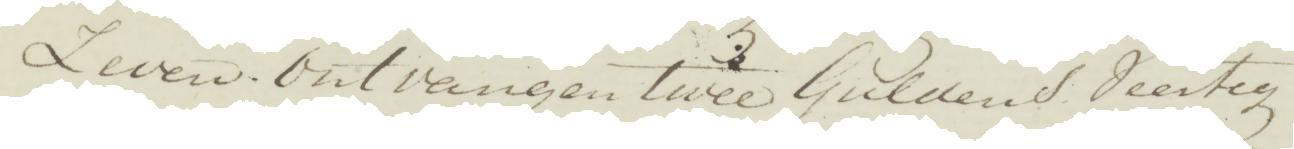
Zeven. Ontvangen twee Guldens Veertig
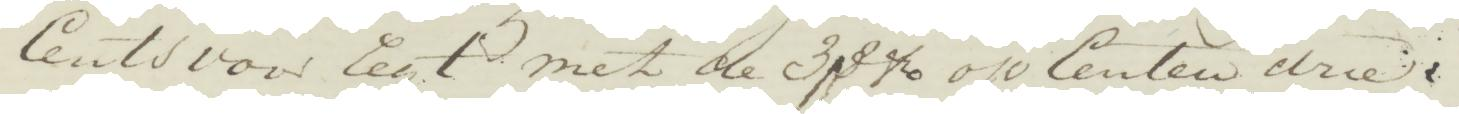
Cents voor regt met de 38% op Centen drie
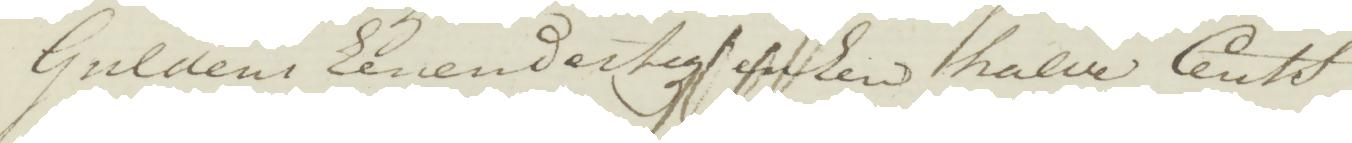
Guldens Eenendertig en Een halve Cents
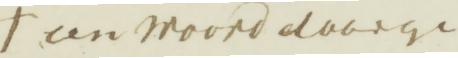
†een woord door ge
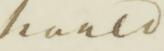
haald
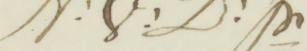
A: v: D: J=r
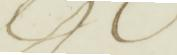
GO
